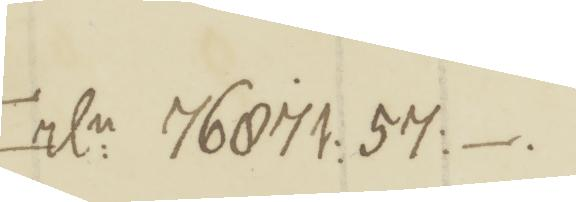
rl:n 76871:57:—
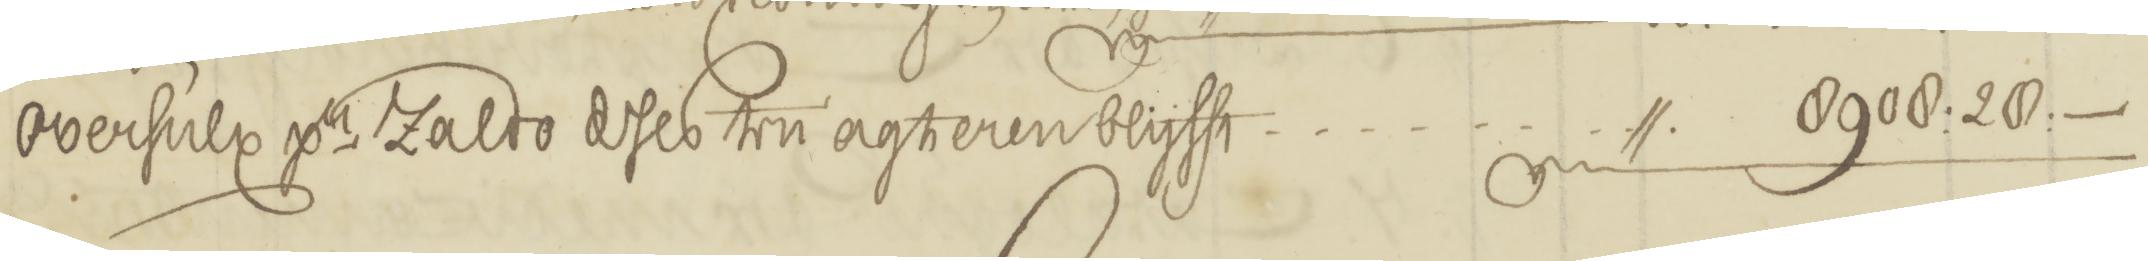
oversulx p=r zaldo deses ten agteren blijfft - - - - - - - „ 8908:28:—
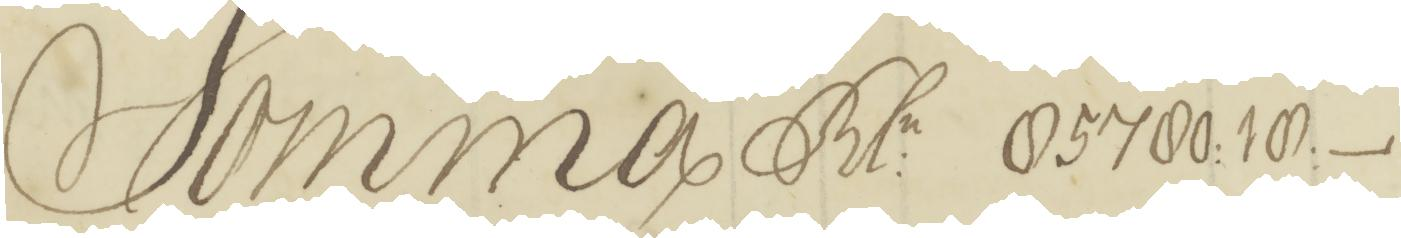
Somma Rl:n 85780:18:—
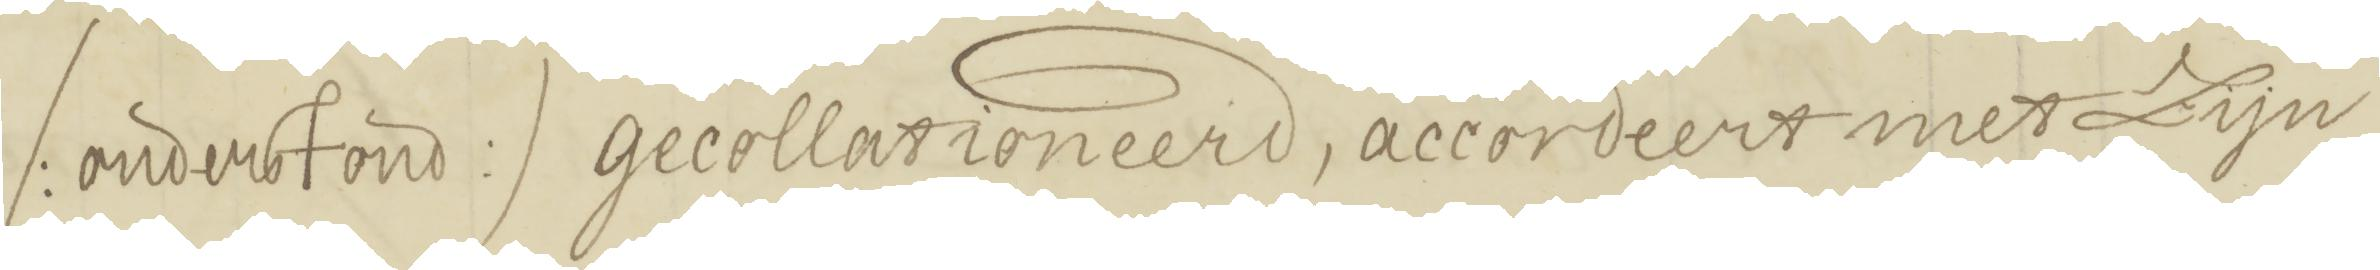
(:onderstond:) gecollationeerd, accordeert met zijn
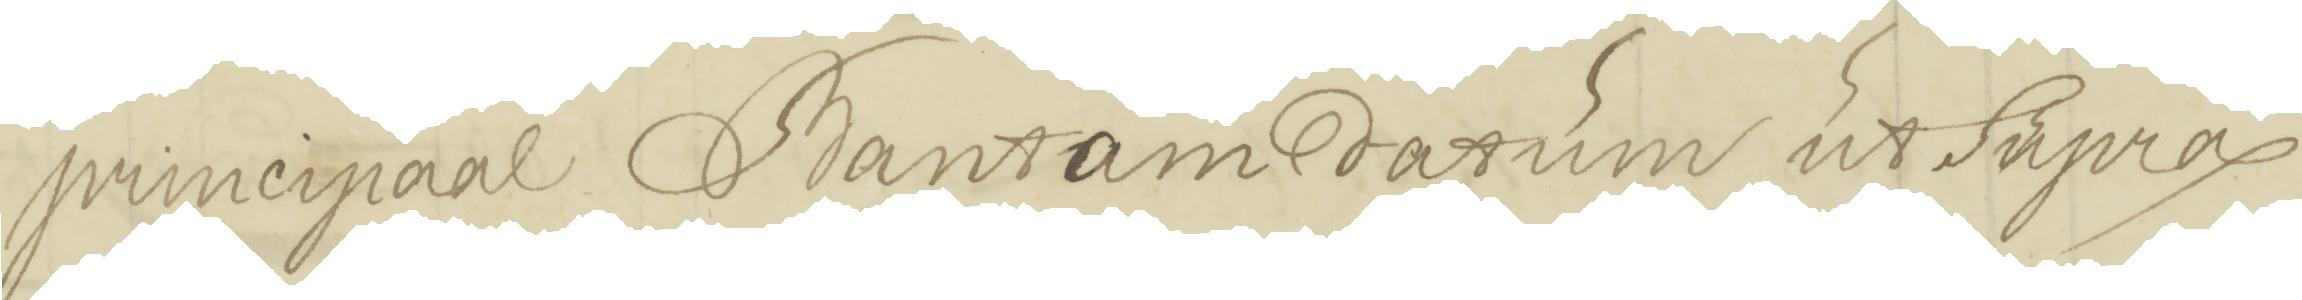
principaal Bantam datum ut Supra
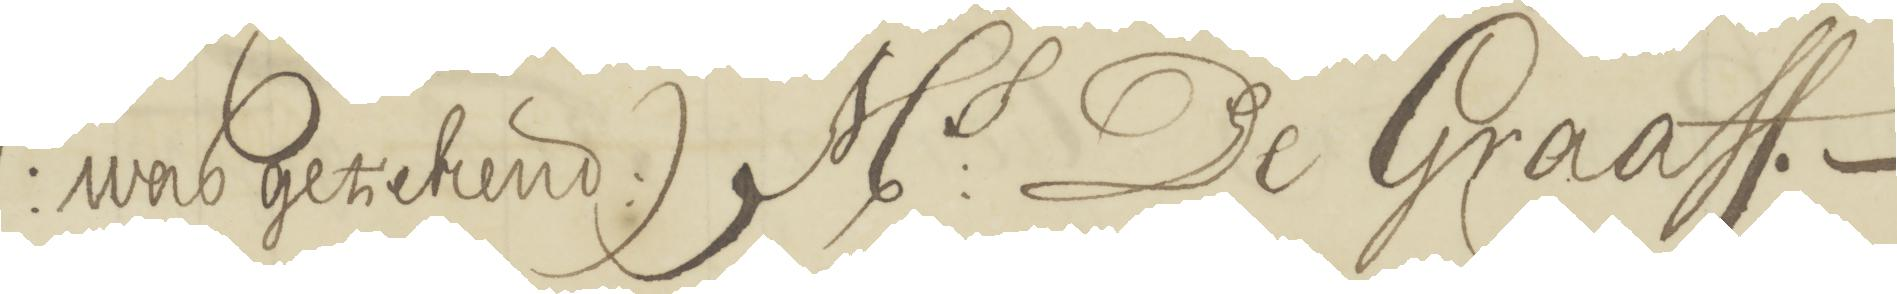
(:was getekend:) M:s De Graaff.—
